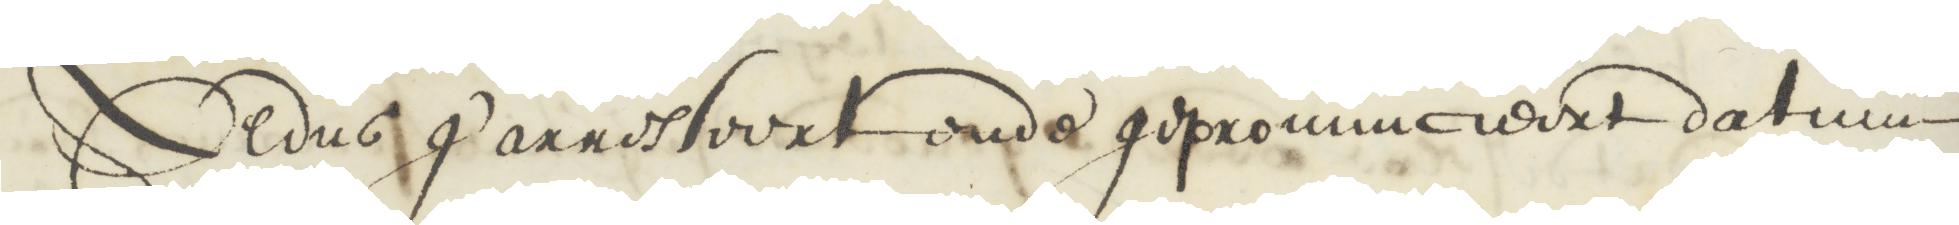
Aldus g’arresteert ende gepronuncieert datum
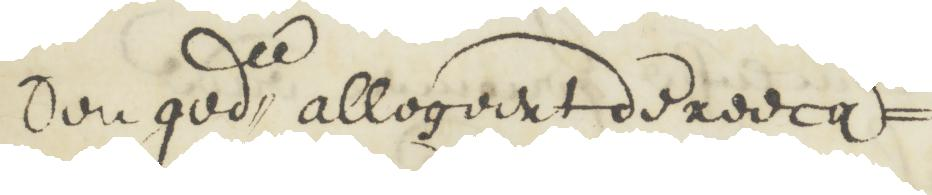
den ged„n allegeert de reecq=n
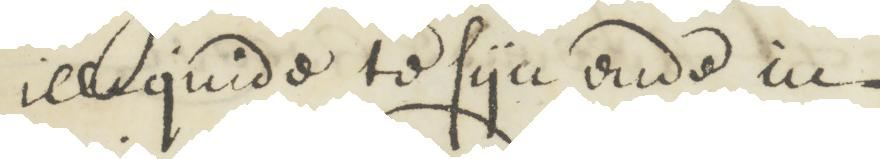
illiquide te sijn ende in
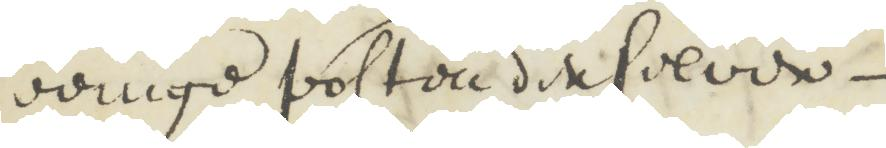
eenige posten derselver
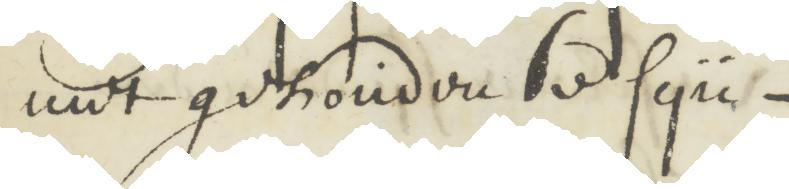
niet gehouden te sijn
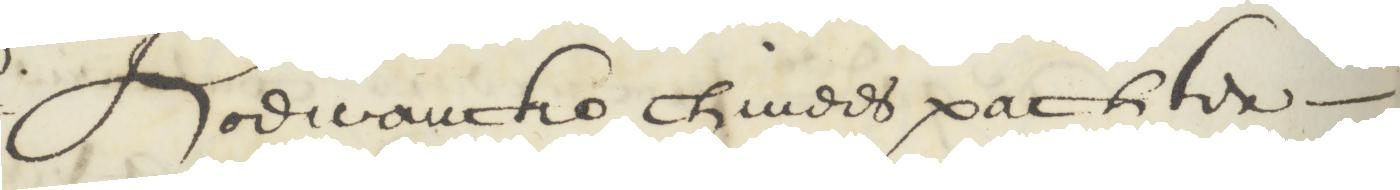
Hoewancko chinees pachter —
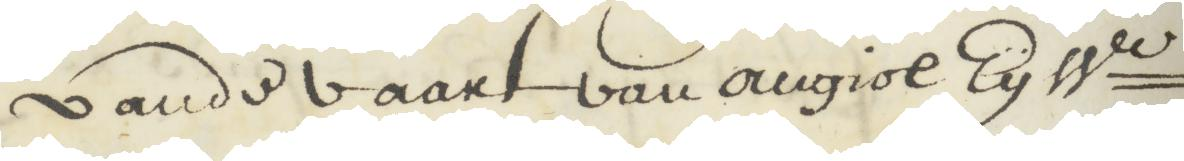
vande vaart van angiol Eijss=r
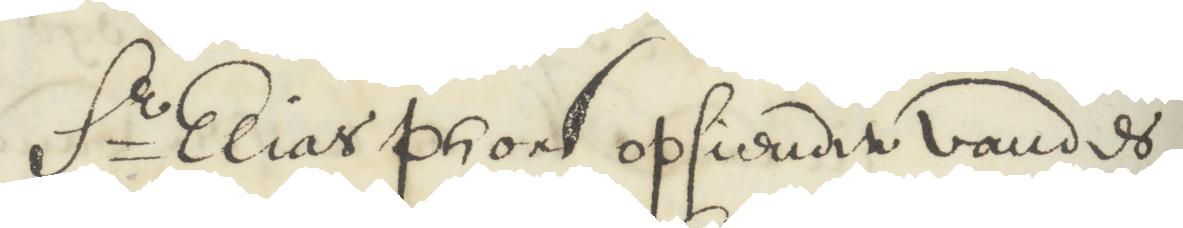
S=r Elias phort opsiender van des
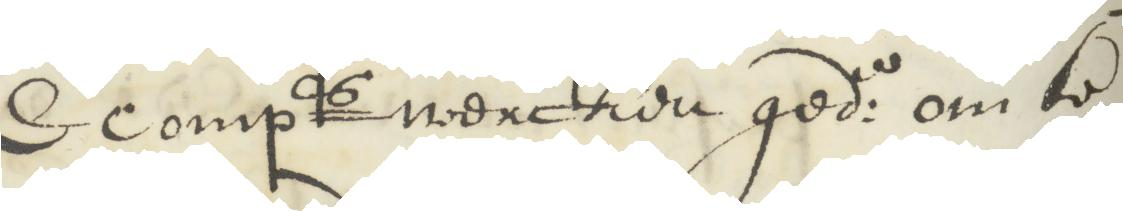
E Comp=s wercken ged:e om te
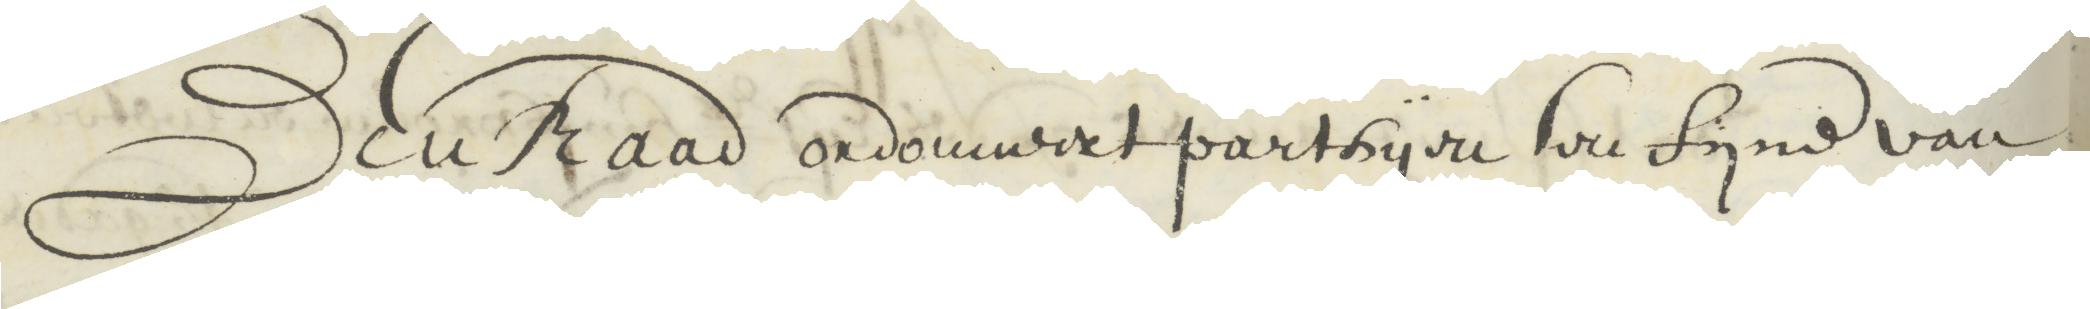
Den Raad ordonneert parthijen ten fijne van
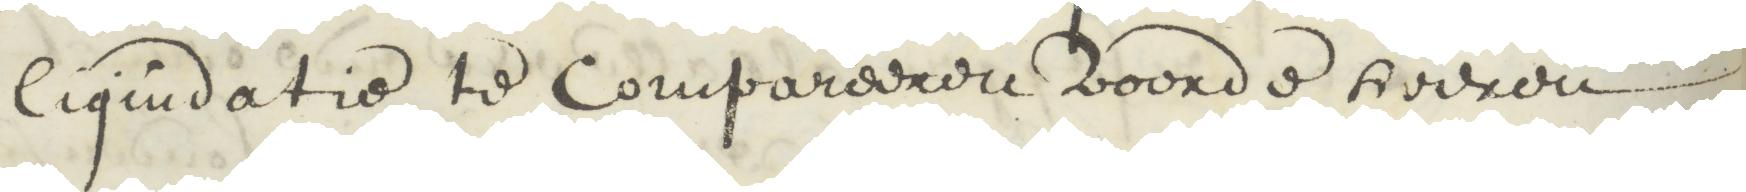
liquidatie te compareeren voorde heeren
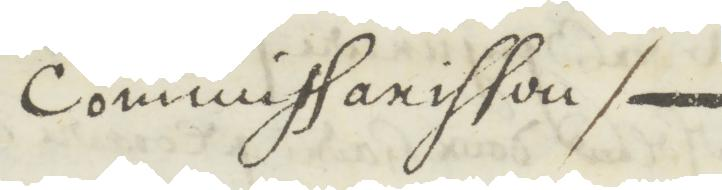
commissarissen / —
